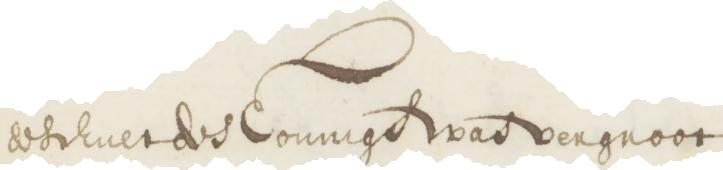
deschult des Conings was vergroot
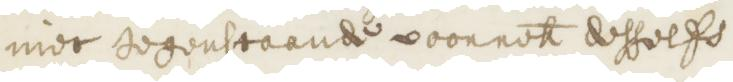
niet tegenstaande voorrek desselfs
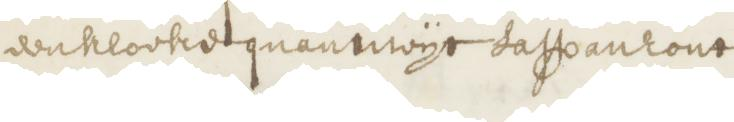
een kloeke quantitijt sappanhout
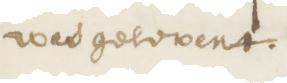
wes gelevert.
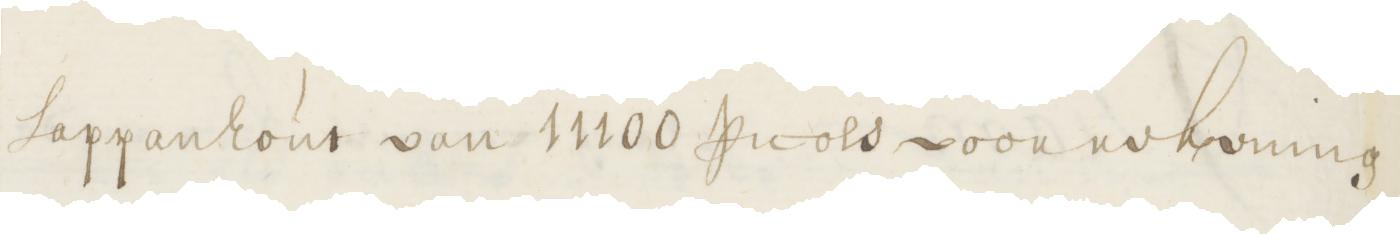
sagganhout van 11100 Picols voor rekening
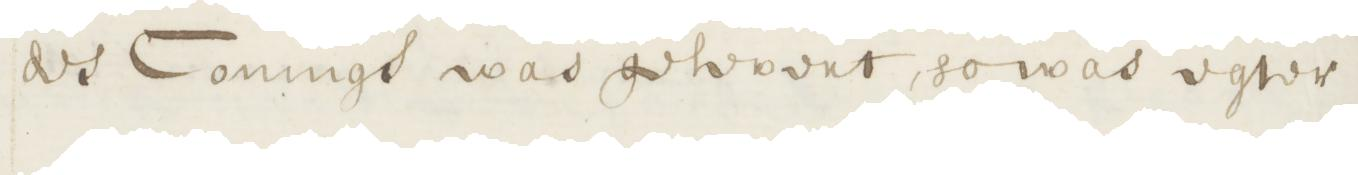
des Conings was gelevert, so was egter
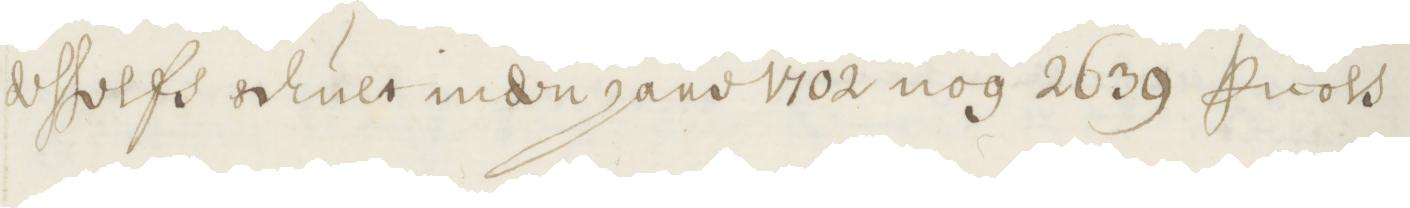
desselfs schult inden jare 1702 nog 2639 Picols
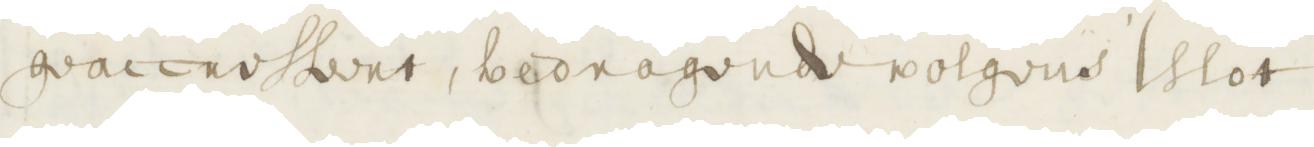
geaccreseert, bedragende volgens 'tslot
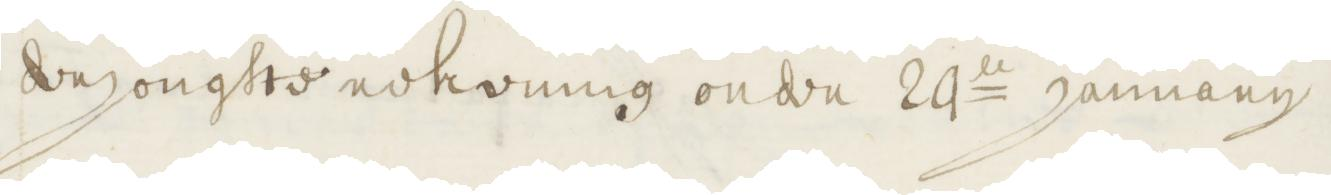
derjongste rekening onder 24=n Januarij
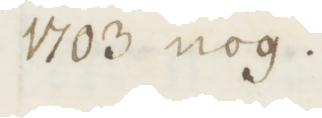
1703 nog.
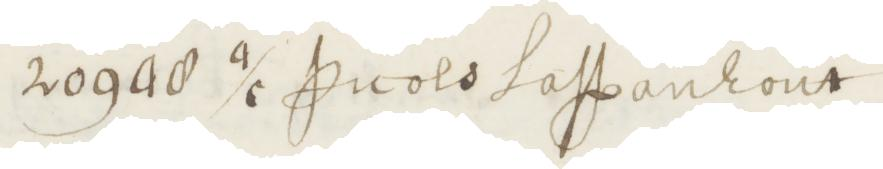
20948 4/5 Picols sappanhout
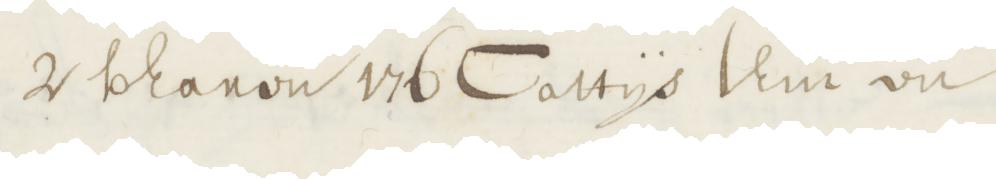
2 bharen176 Cattijs thin en
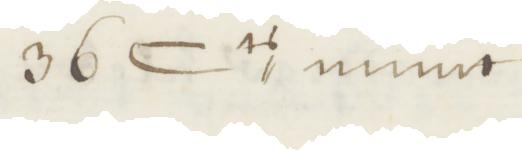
36 C„ts munt
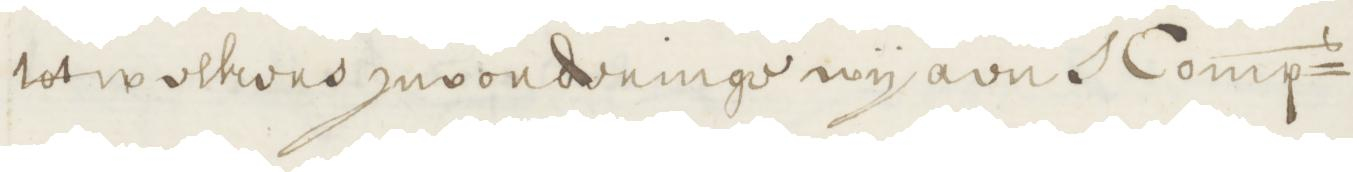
tot welkers jnvorderinge wij aen sComp=s
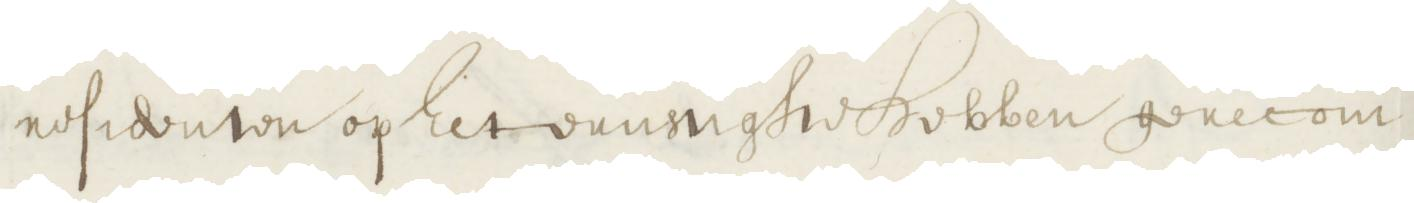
residenten op het ernstigh hebben gerecom
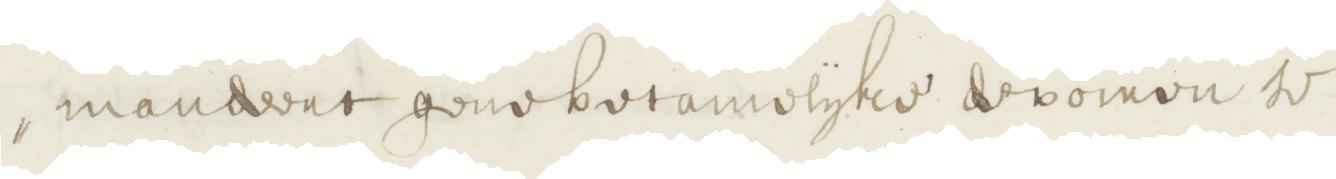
„ mandeert gene betamelijke devoiren te
